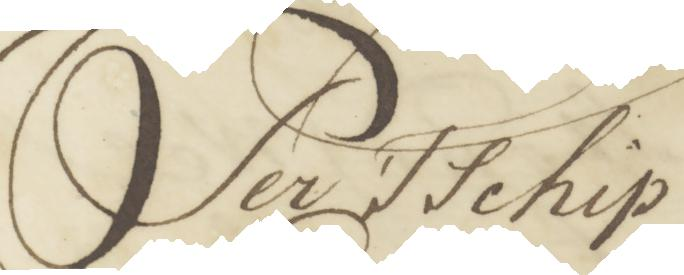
Per 'T schip
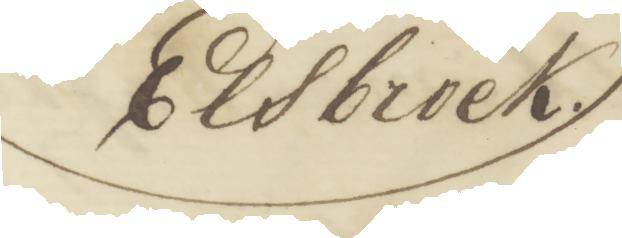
Elsbroek.
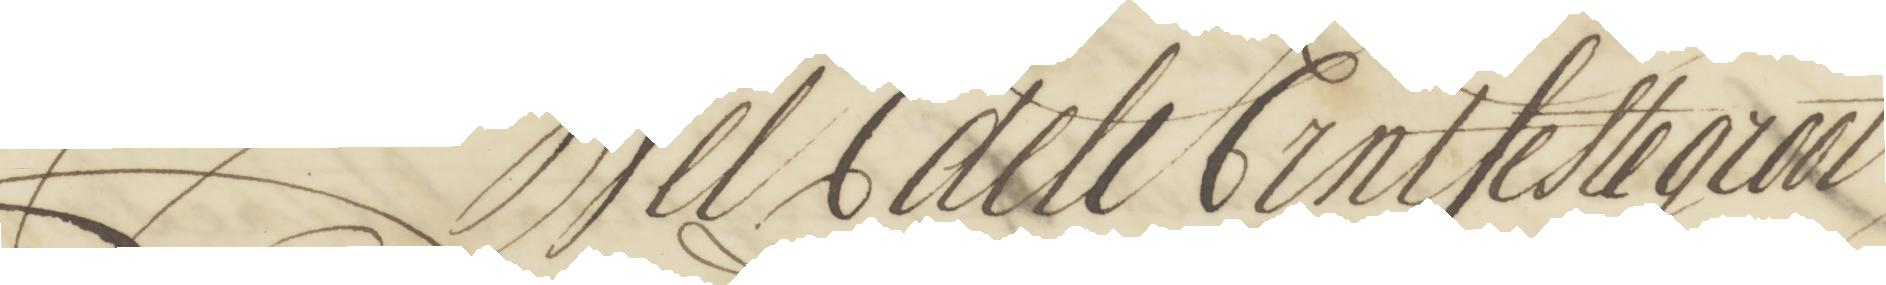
Wel Edele Erntfeste groot
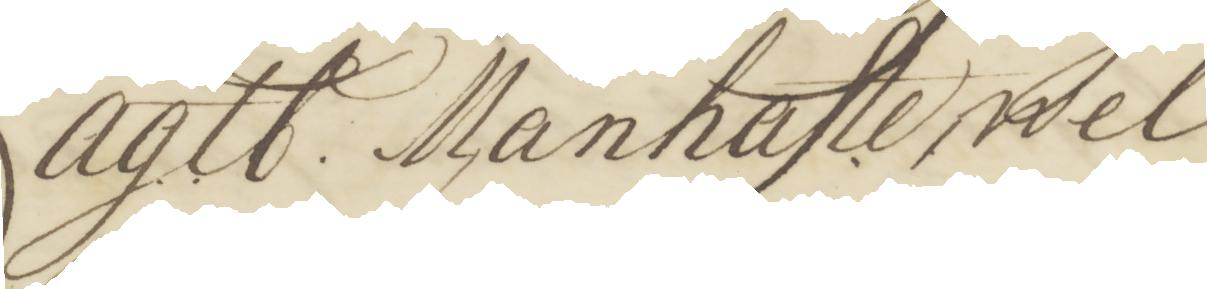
agtb: Manhafte, wel
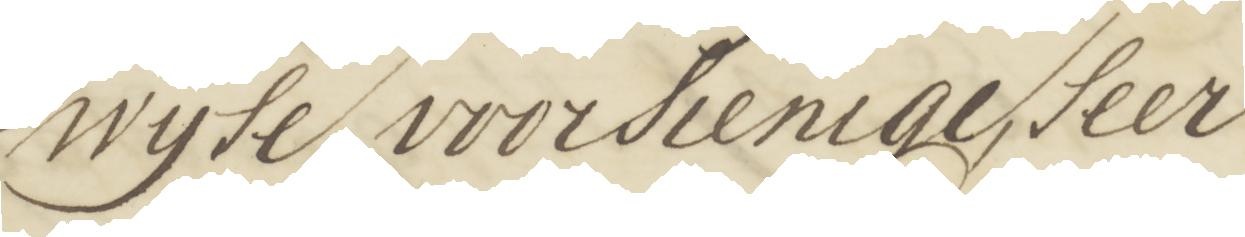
wyse, voorsienige, seer
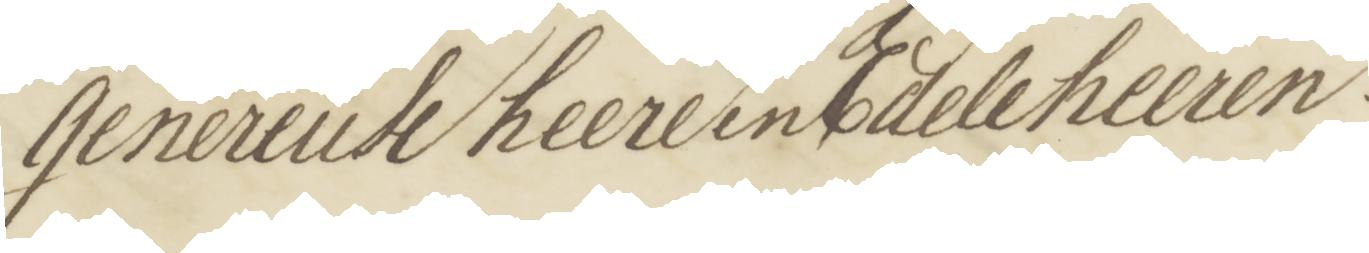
genereuse heere en Edele heeren
